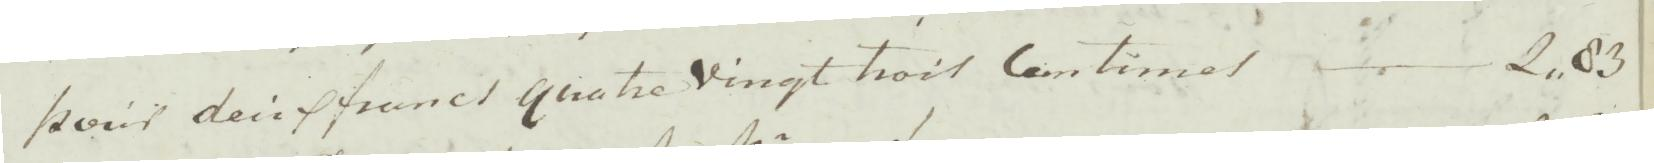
pour deux francs quatre Vingt trois Centimes — 2„83
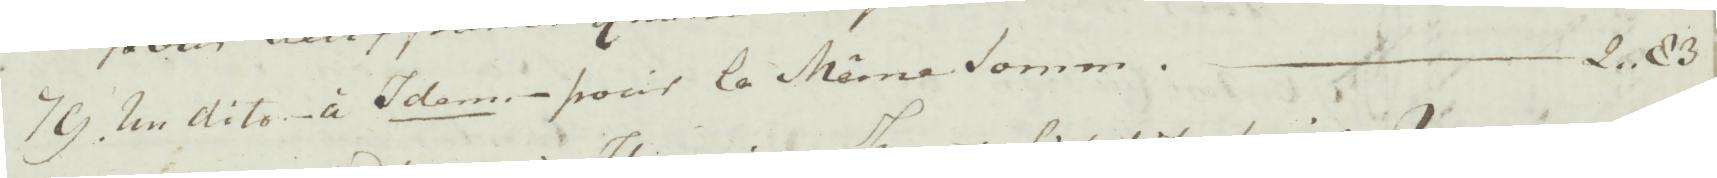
79. Un dito. - à Idem.- pour la Même Somm. — 2„83
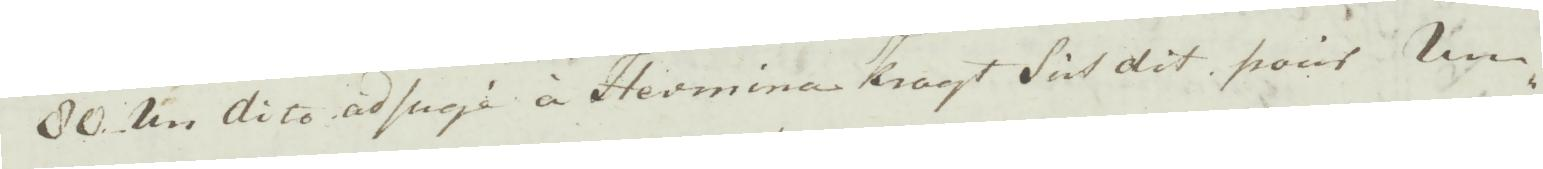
80. Un dito adjugé à Hermina Kragt Sus dit. pour Un„
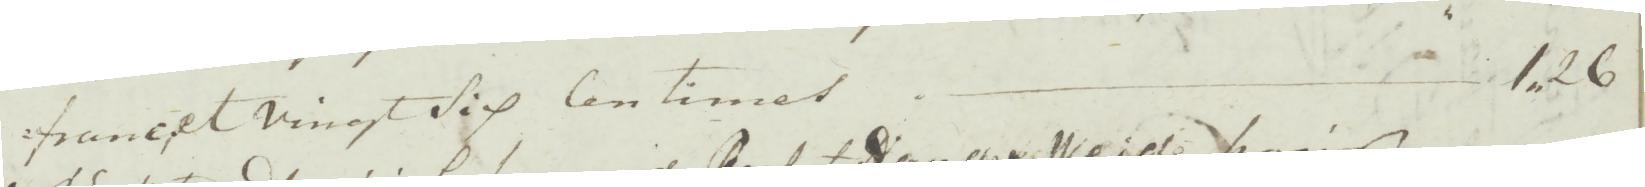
„franc et vingt six Centimes — 1„26
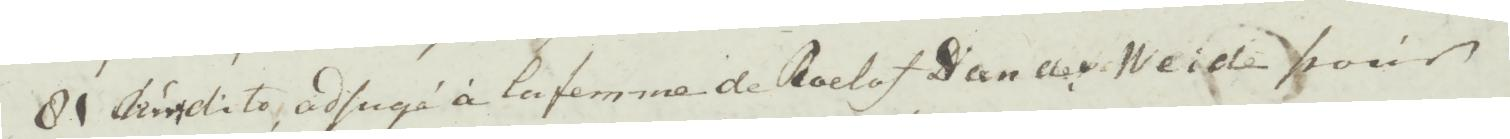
81 huit dito, adjugé à la femme de Roelof Van der Weide pour
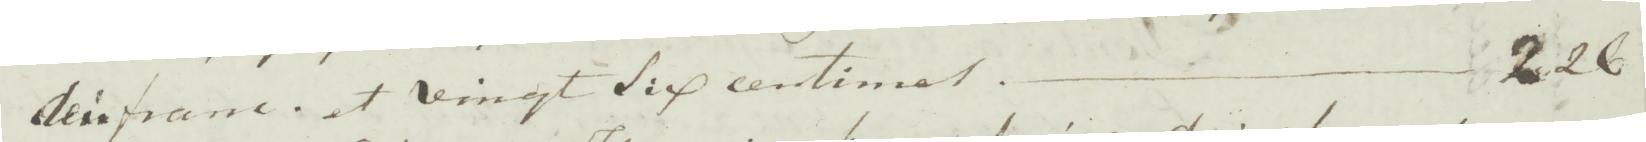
deu franc, et vingt six centimes — 2„26
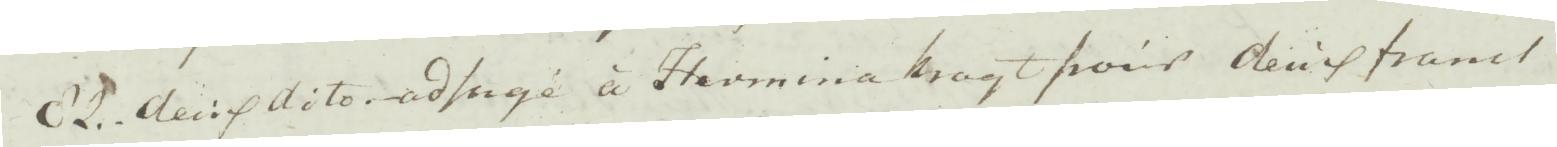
82. deux dito adjugé à Hermina kragt pour deux francs
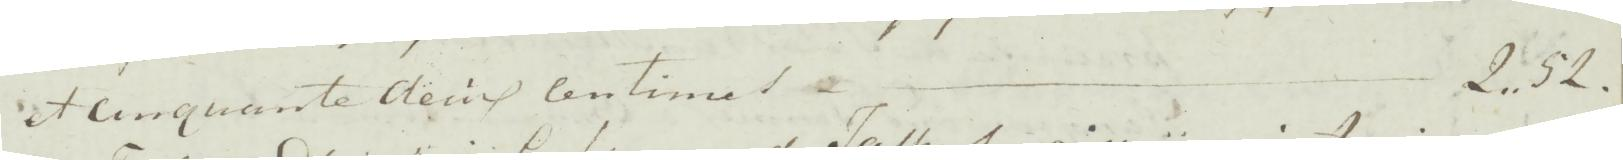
et Cinquante deux Centimes — 2„52.
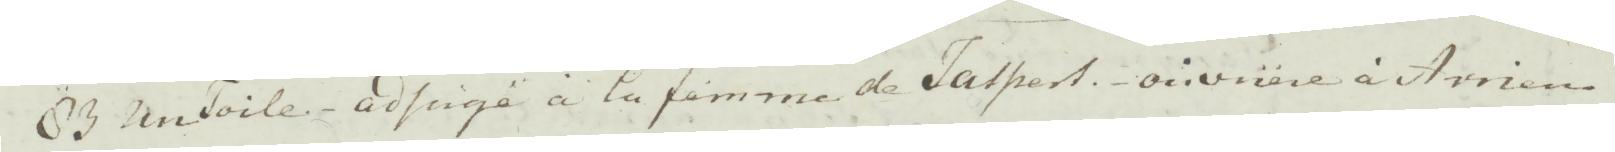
83 Un Toile. - adjugé à la femme de Iaspers. -ouvrière à Arrien
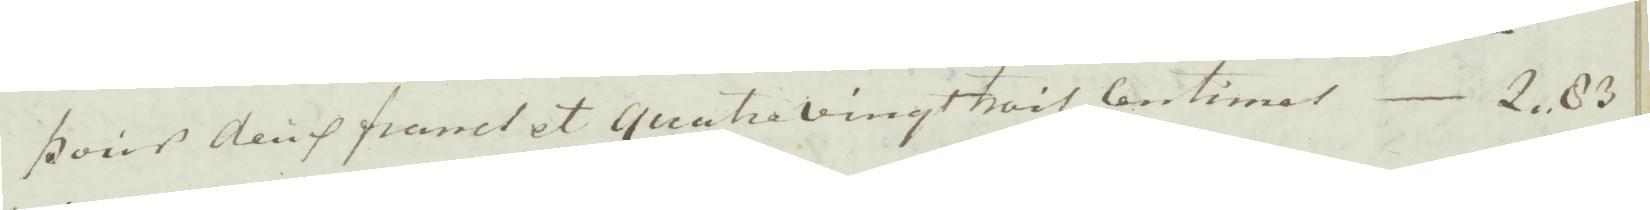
pour deux francs et quatre vingt trois Centimes — 2„83
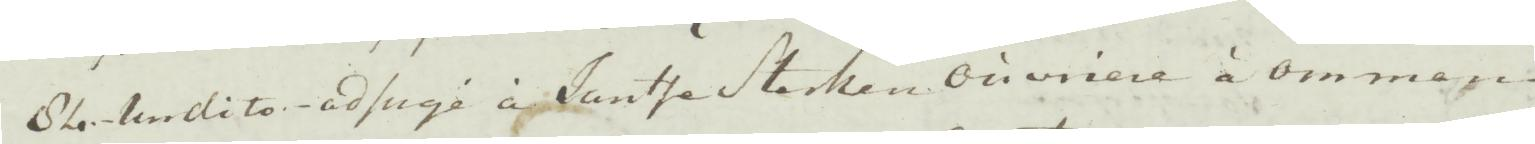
84.- Un dito. -adjugé à Iantje Sterken ouvriere à Ommen
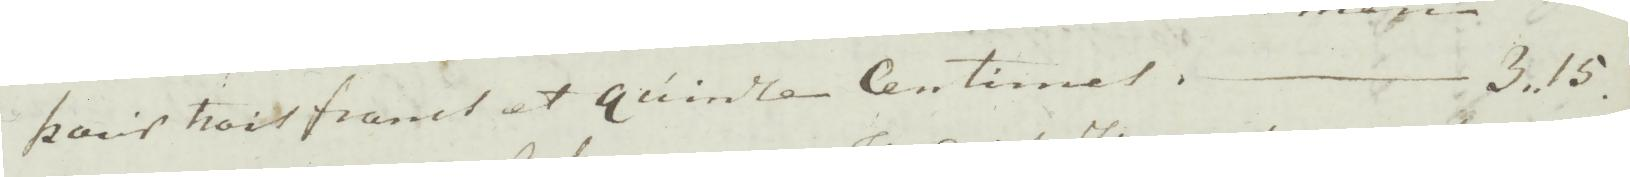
pour trois francs et quinze Centimes. — 3„15.
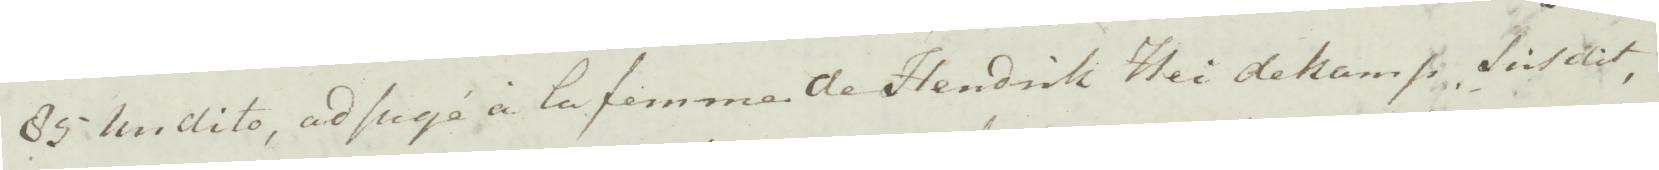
85 Un dito, adjugé à la femme de Hendrik Heidekamp, Sus dit,
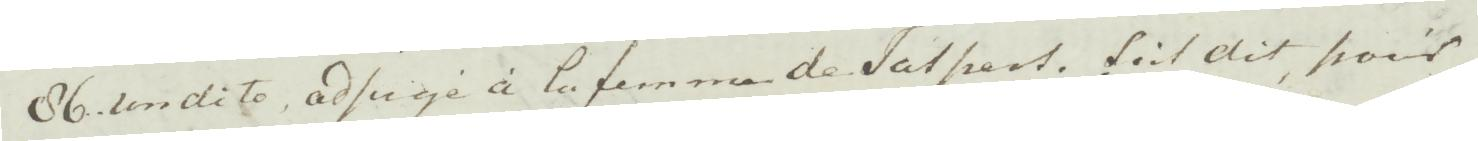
86. Un dito, adjugé à la femme de Iaspers, Sus dit, pour
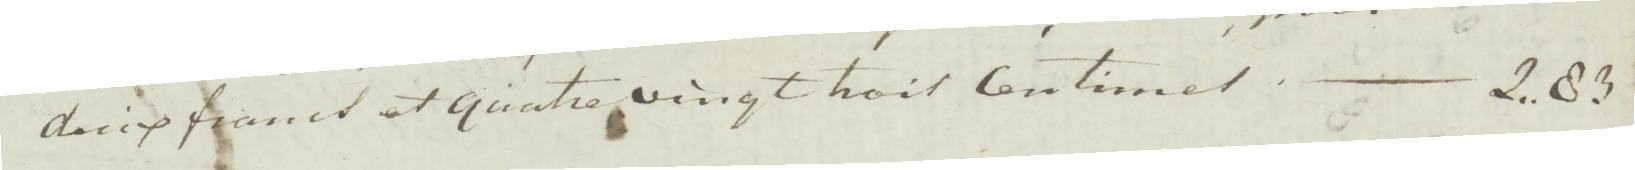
deux francs et quatre vingt trois Centimes — 2„83
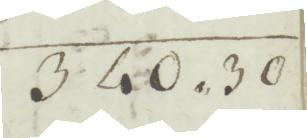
3 40„30
